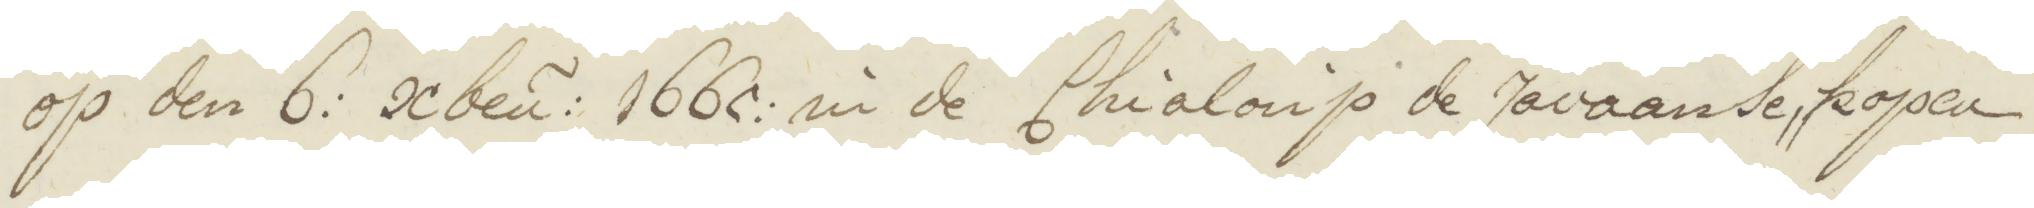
op den 6: xber: 1665: in de Chialoup de Javaanse„ koper
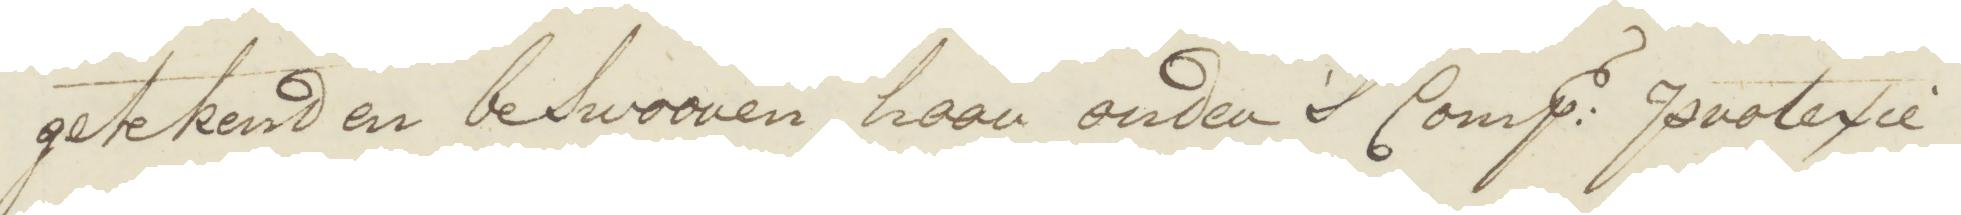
getekend en beswooren, haar onder ’s Comp:s protexie
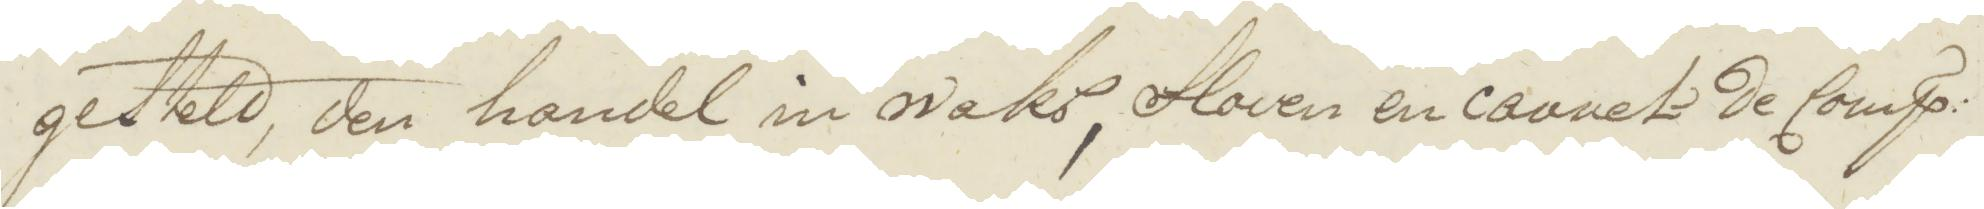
gesteld, den handel in waks, slaven en cavret de Comp:
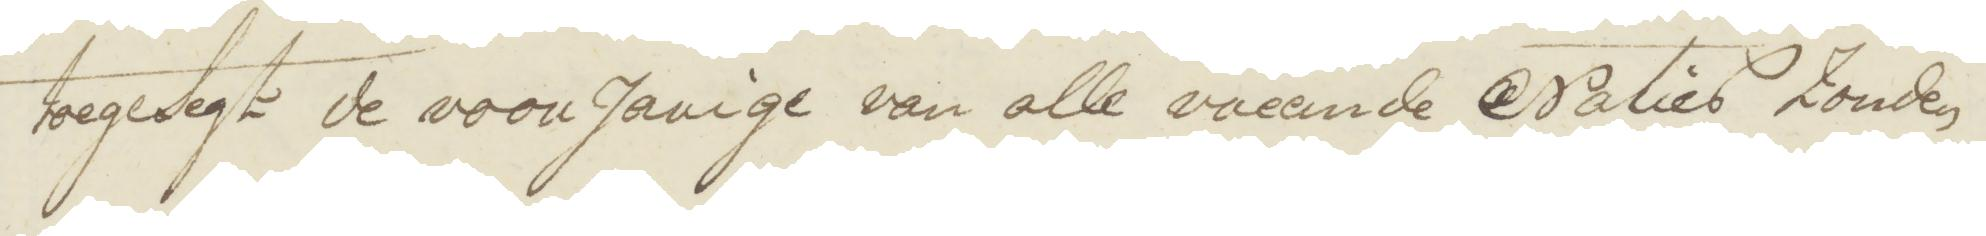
toegesegt de voor Jarige van alle vreemde Naties zonder
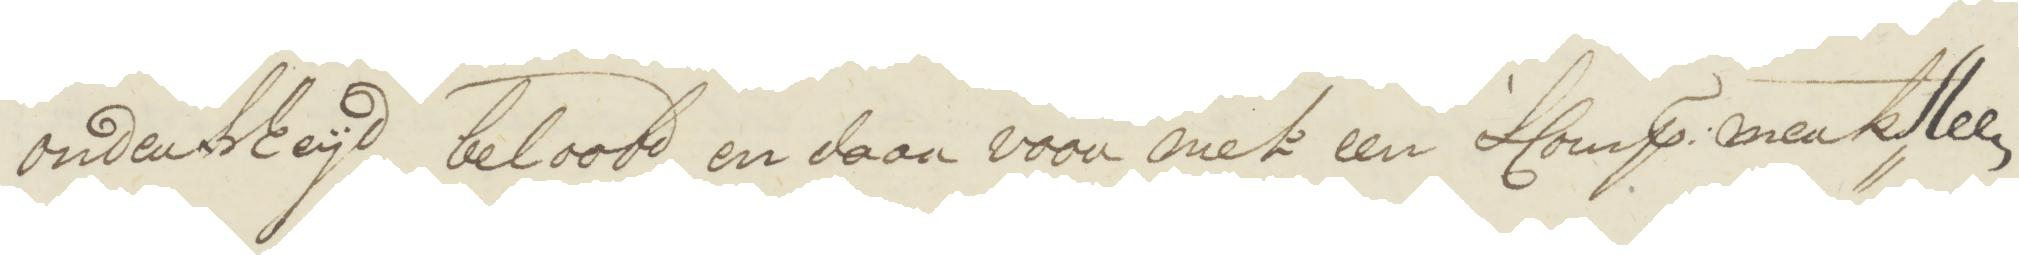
onderscheijd beloofd, en daar voor met een ’sComp: merk„steen
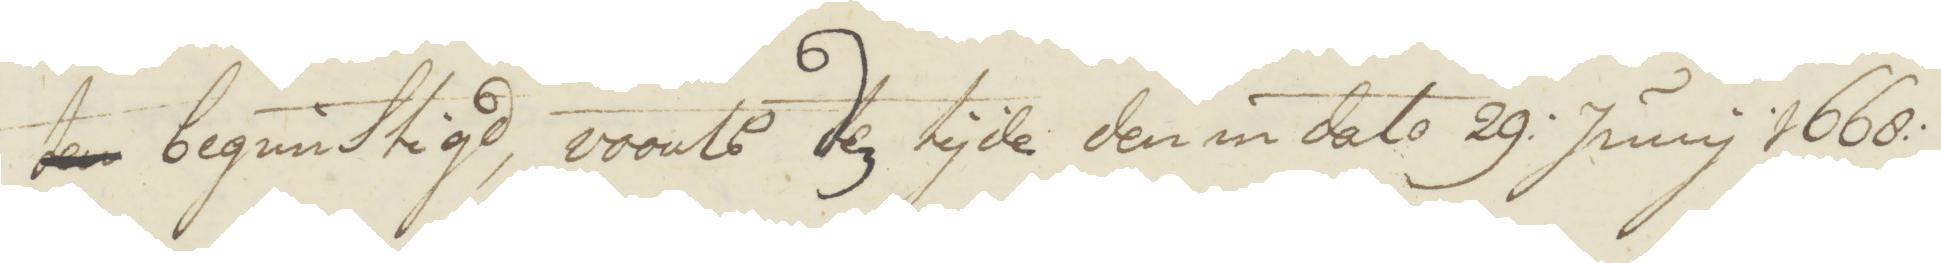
ten begunstigd, voorts den tijde den in dato 29: Junij 1668:
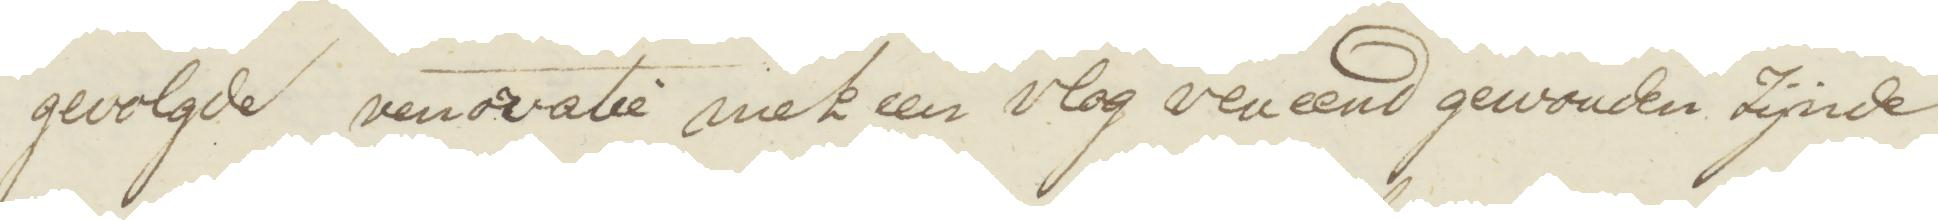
gevolgde renovatie met een vlag vereerd geworden zijnde
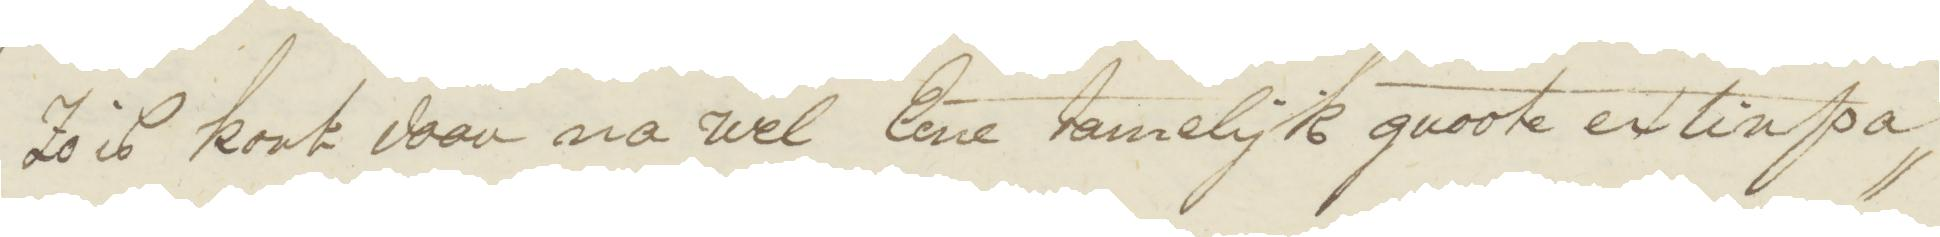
zo is kort daar na wel Eene tamelijk groote extirpa„
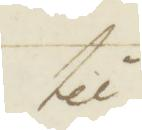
tie
